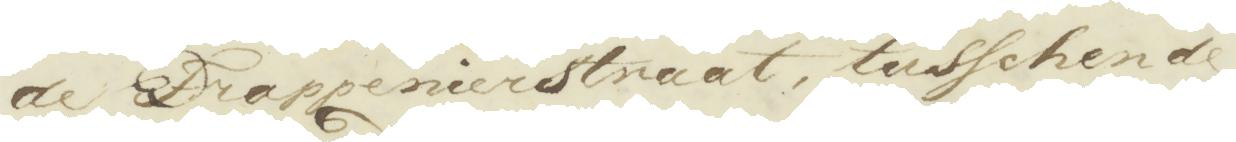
de Drappenierstraat, tusschen de
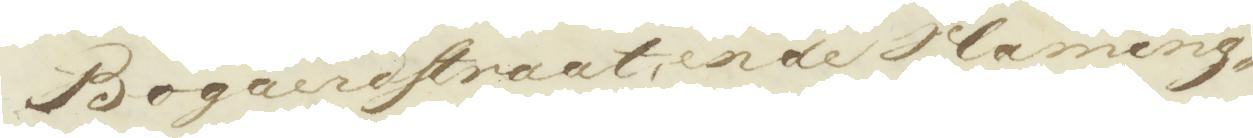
Bogaerdstraat, ende Vlaming
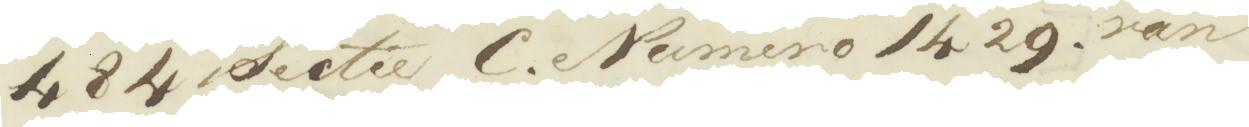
484 sectie C. Numero 1429. van
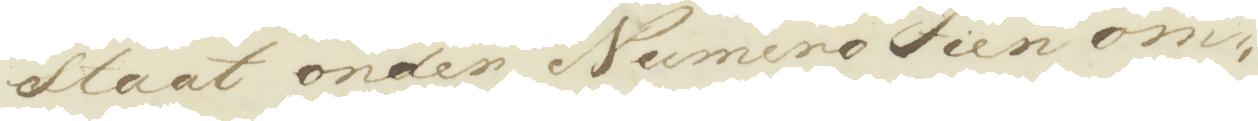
staat onder Numero Tien om„
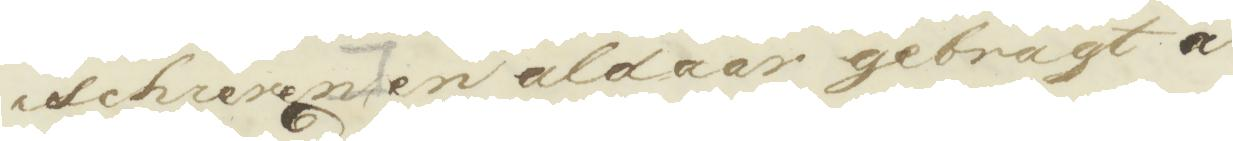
schreven] en aldaar gebragt à
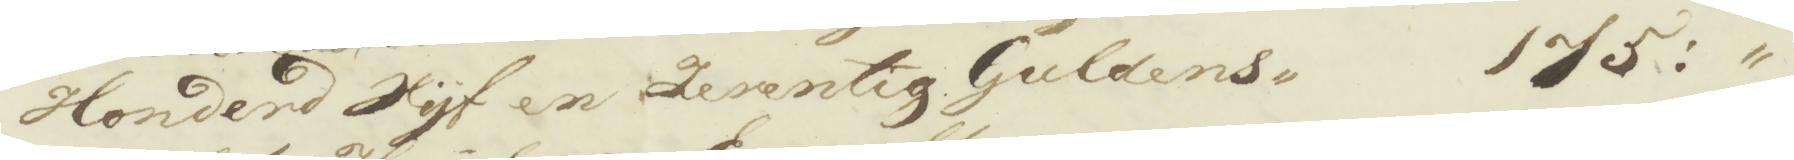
Honderd Vijf en zeventig Guldens„ 175: „
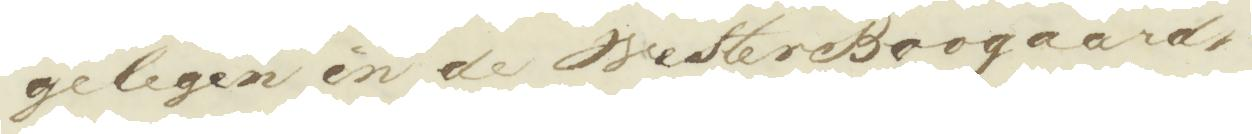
gelegen in de WesterBoogaard,
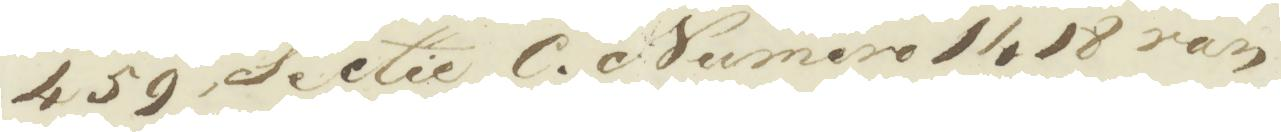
459, sectie C. Numero 1418 van
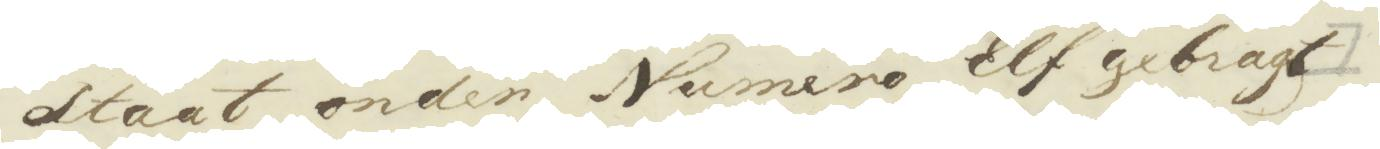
staat onder Numero Elf gebragt]
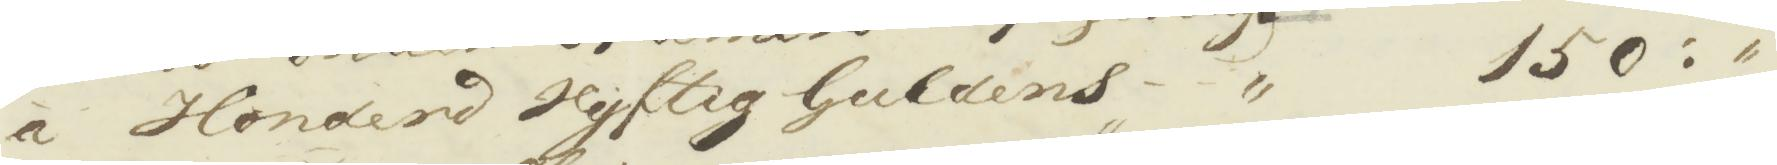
à Honderd Vijftig Guldens - - „ 150 : „
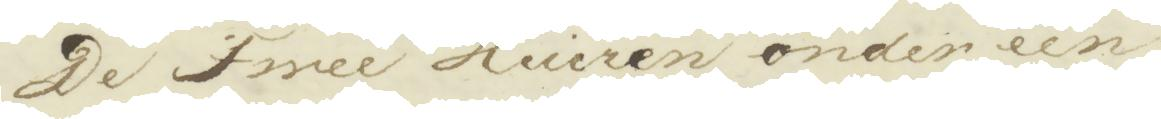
De Twee Huizen onder één
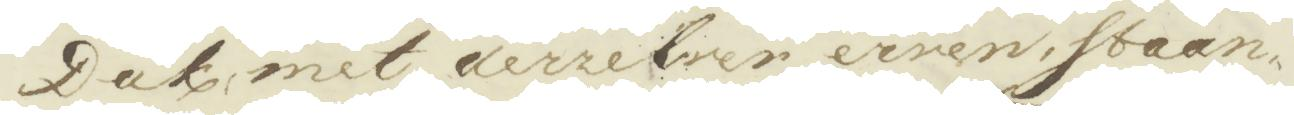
Dak, met derzelver erven, staan„
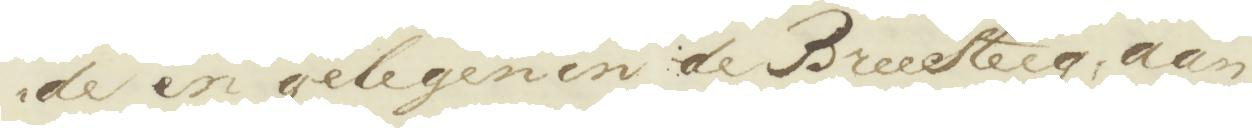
de en gelegen in de Breesteeg, aan
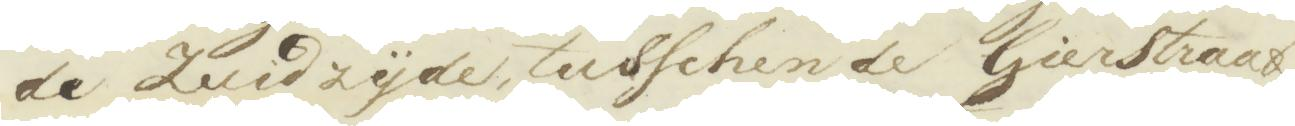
de Zuidzijde, tusschen de Gierstraat
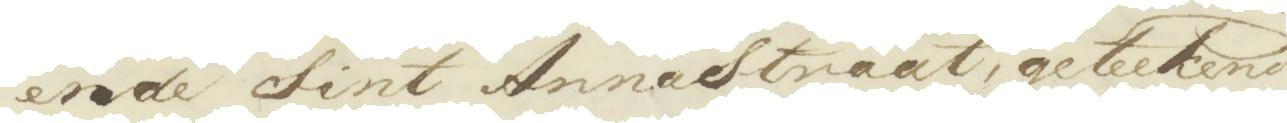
ende Sint Annastraat, geteekend
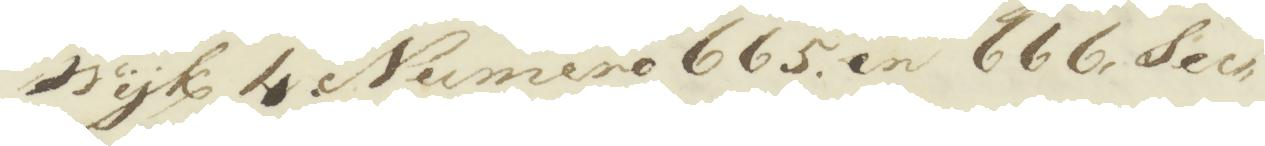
Wijk 4 Numero 665. en 666. sec„
